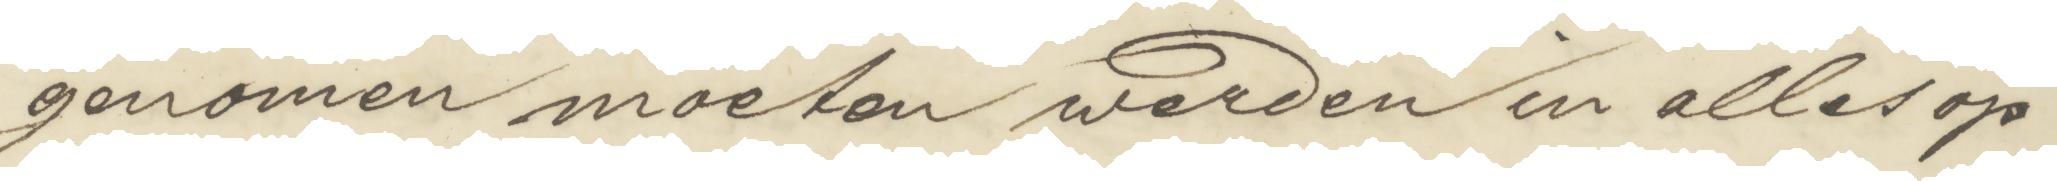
genomen moeten werden in alles op
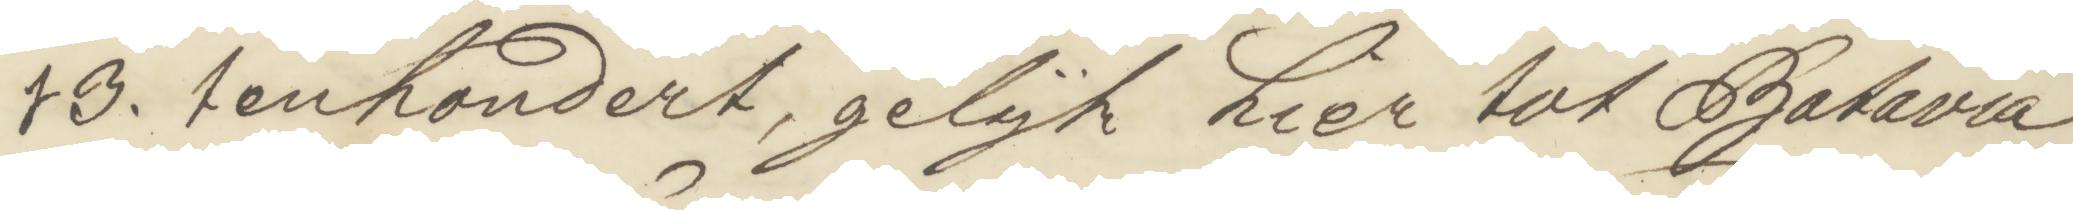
13. tenhondert, gelijk hier tot Batavia
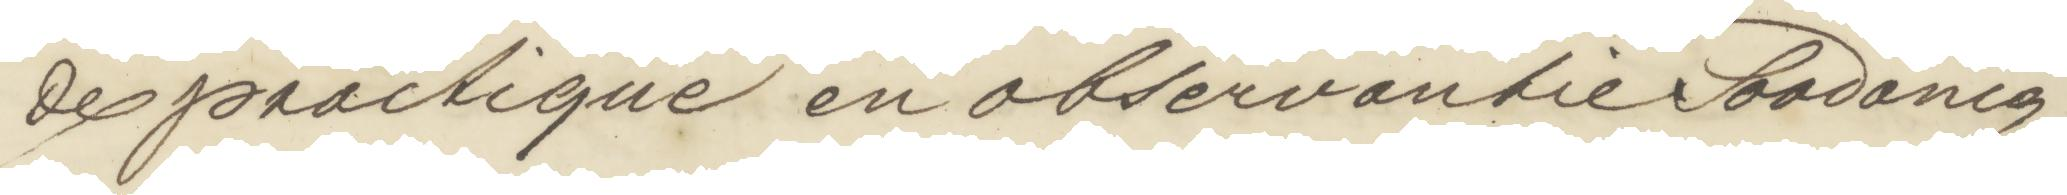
de practique en observantie soodanig
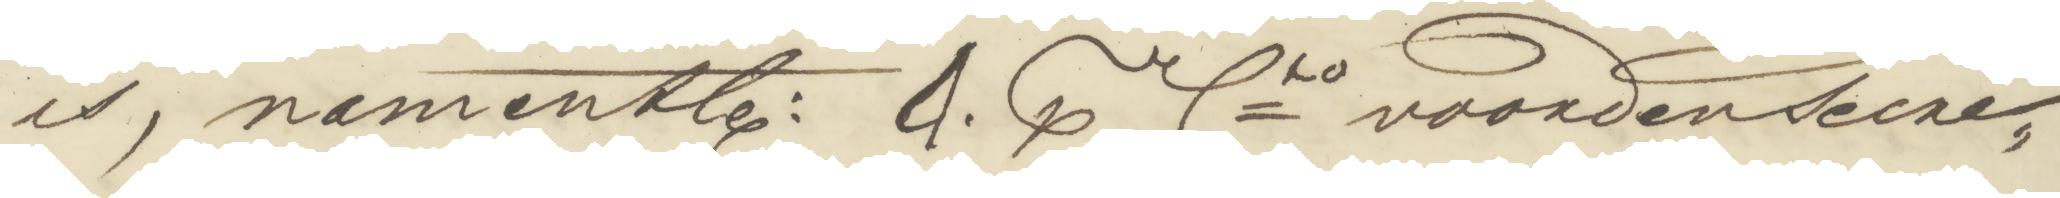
is, namentlyk: 4. pr C=to voorden secre„
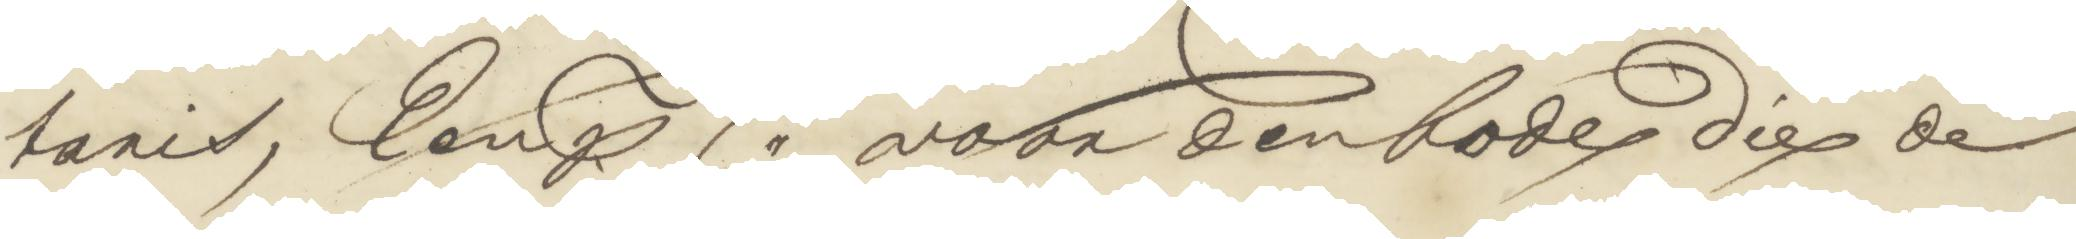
taris, Een pr C„t voor den bode die de
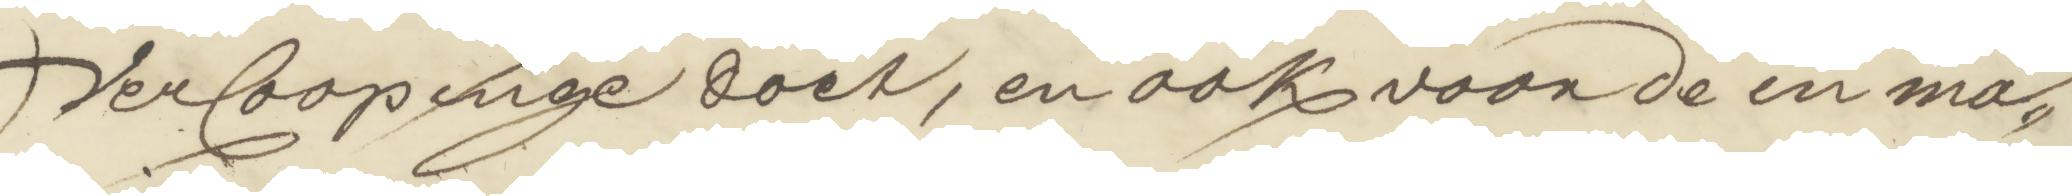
vercoopinge doet, en ook voor de in ma„
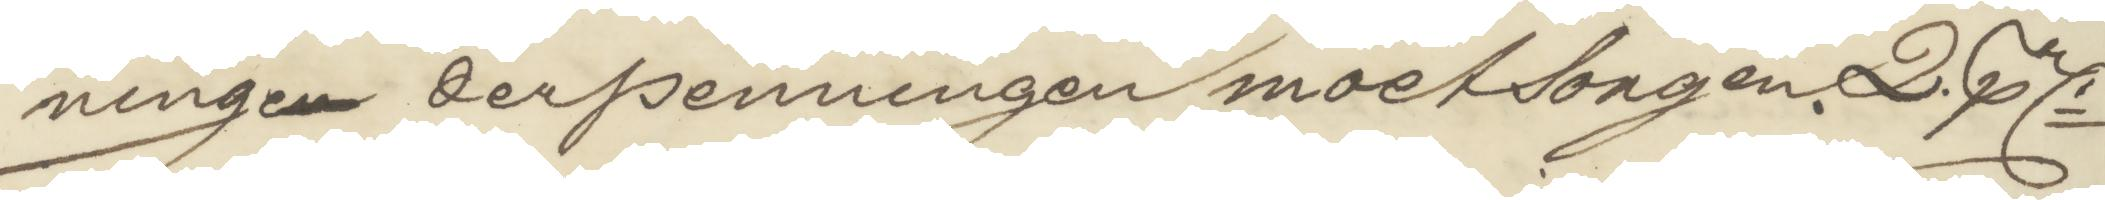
ningen der penningen moet sorgen 2. pr C=t
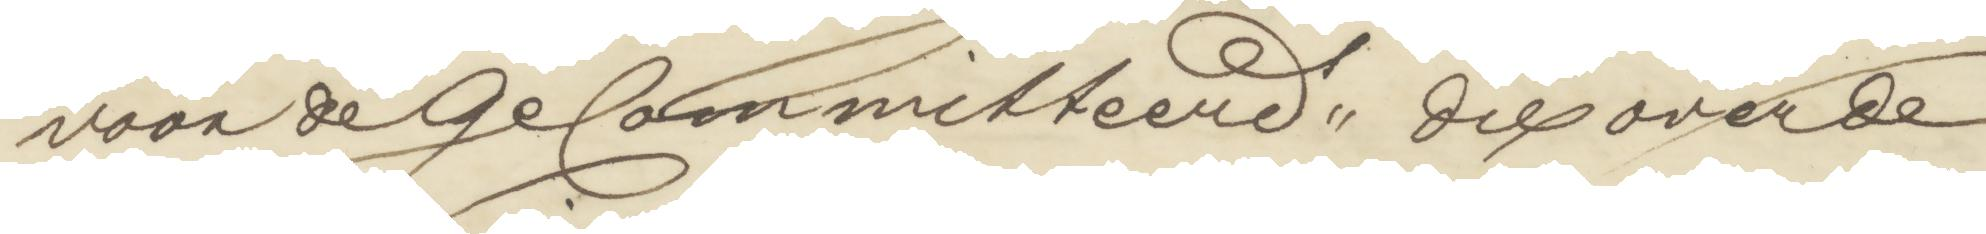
voor de gecommitteerd„s die over de
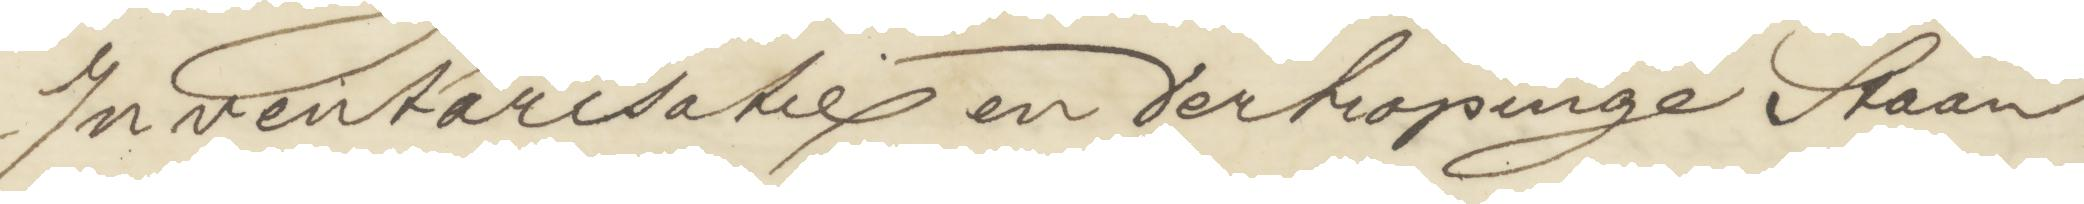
Jnventarisatie en verkopinge staan
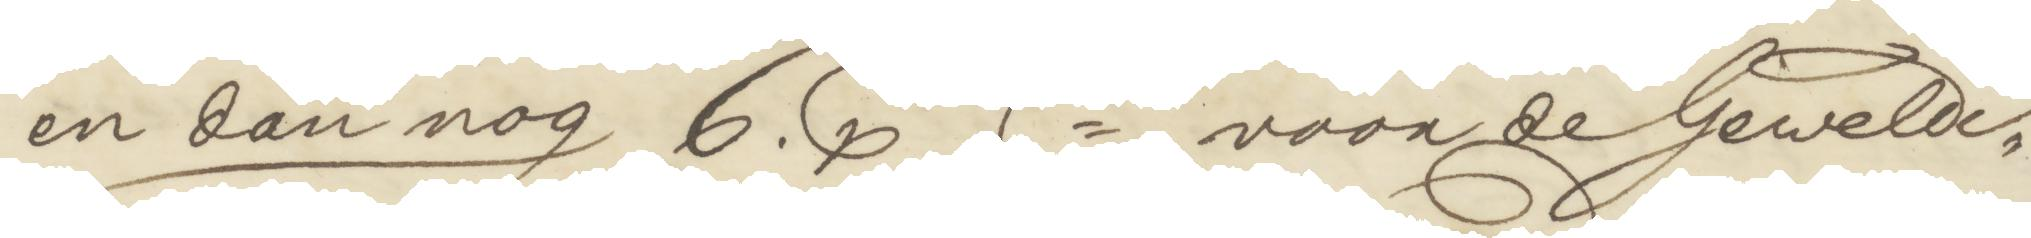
en dan nog 6. pr C=to voor de Geweldi„
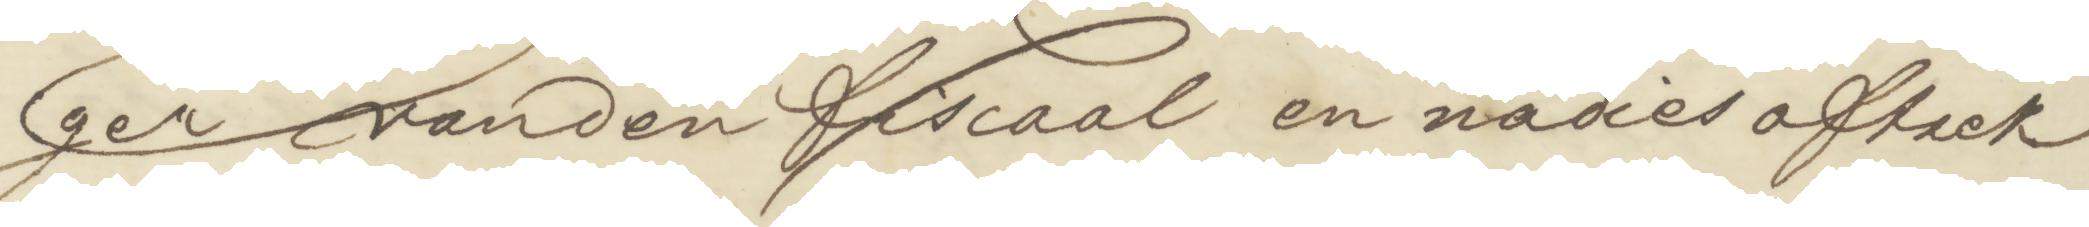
ger van den fiscaal en nadies aftrek
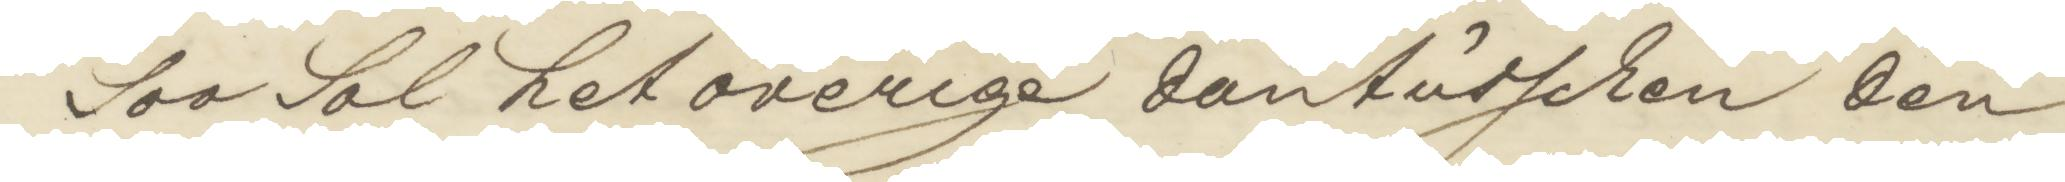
soo sal het overige dan tusschen den
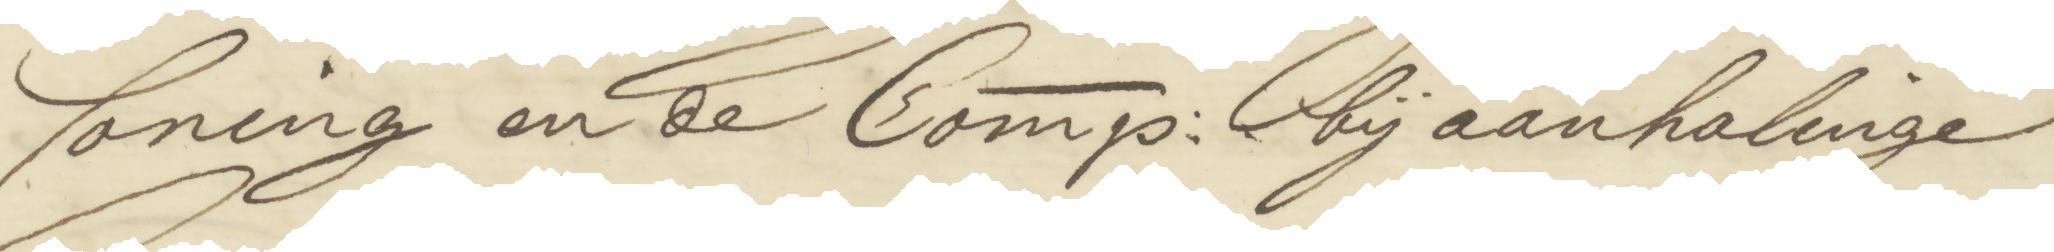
Coning en de Comp: bij aanhalinge
